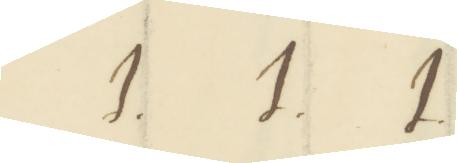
1. 1. 1
